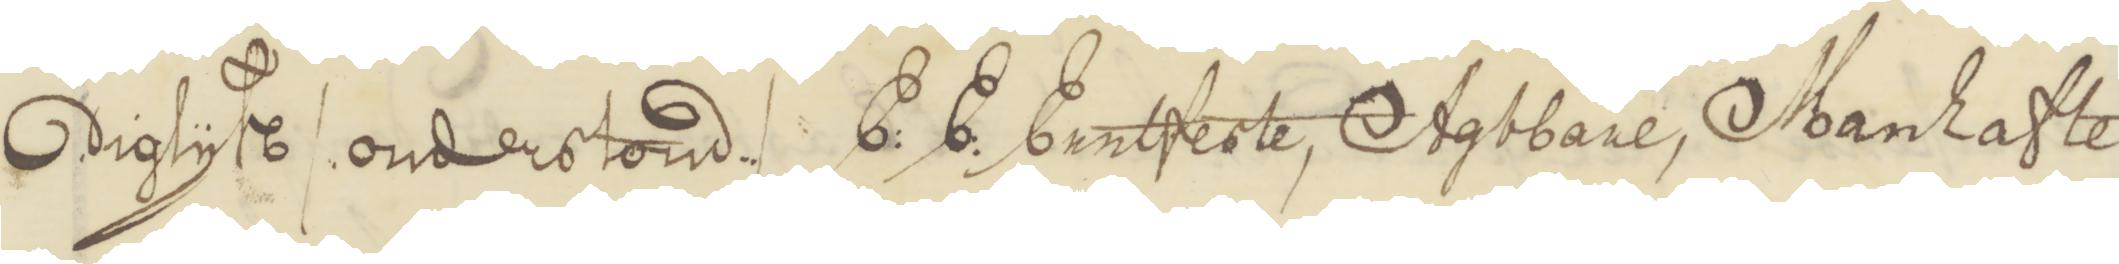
diglijk /:onderstond:/ E: E: Erntfeste, Agtbare, Manhafte
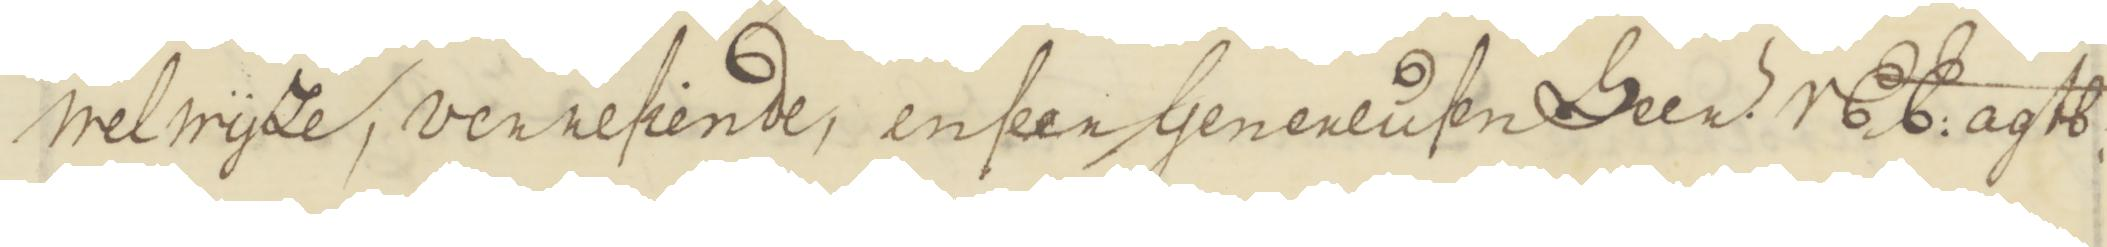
wel wijze, verresiende, en seer Genereusen Heer. VEE: agtb:
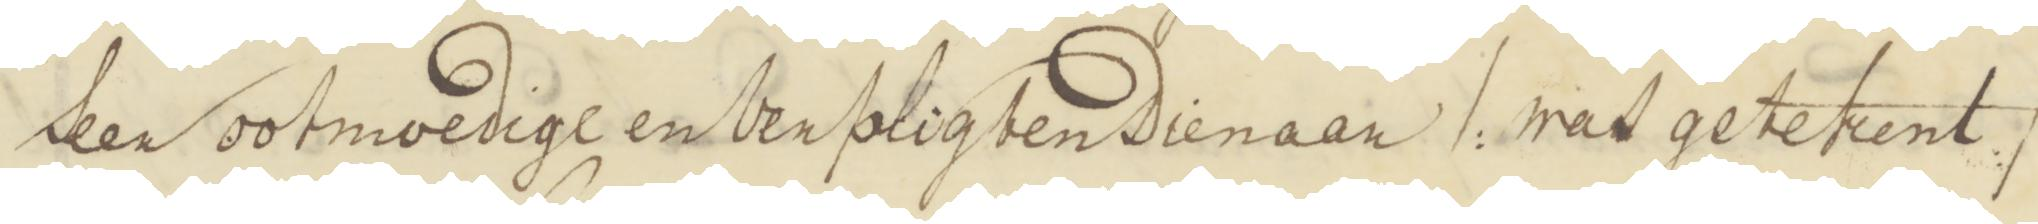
seer ootmoedige en Verpligten Dienaar /:was getekent:/
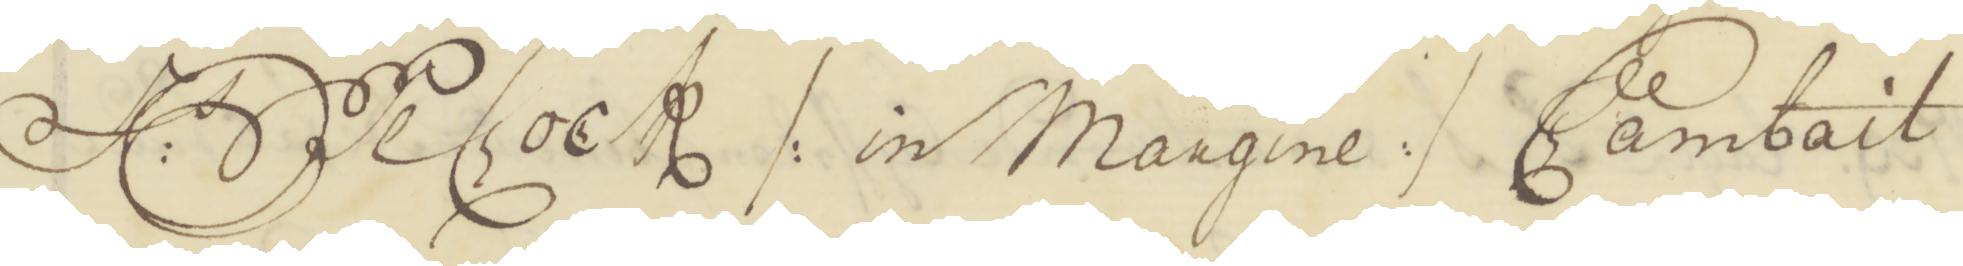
J:s PeCock /: in Margine :/ Cambait
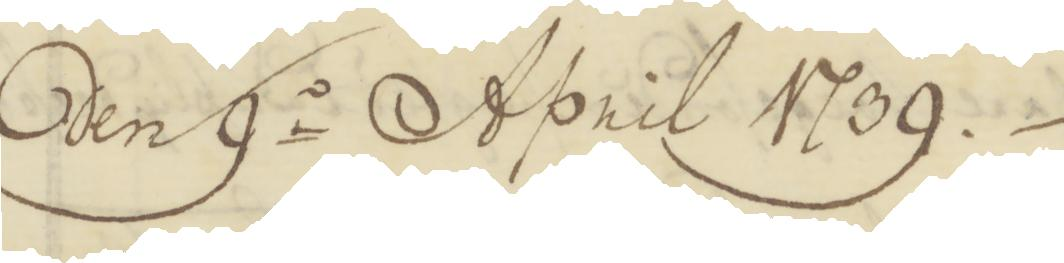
den 9=e April 1739. —
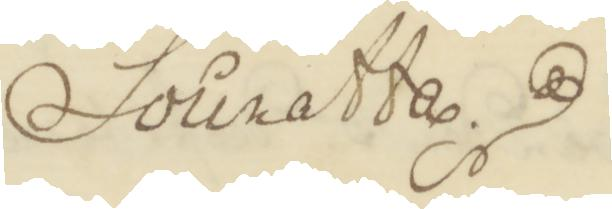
Souratta.
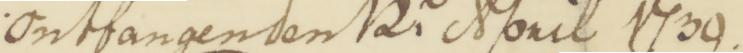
ontfangen den 12:e April 1739.
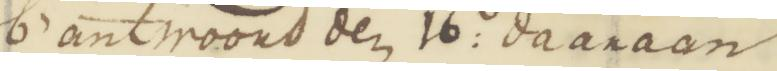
b'antwoord den 16:e daaraan
